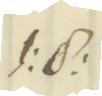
1:8:
